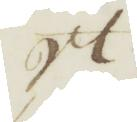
v=t
